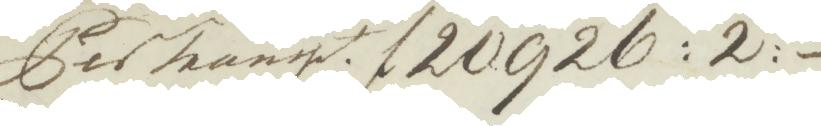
Per Transp„t ƒ20926 : 2: —
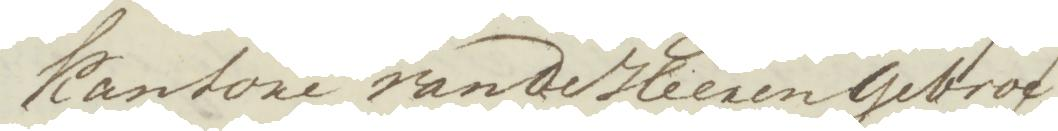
Kantore van de Heeren Gebroe:
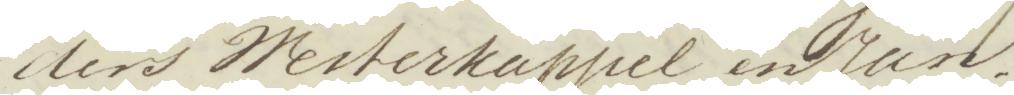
ders Westerkappel en Jan„
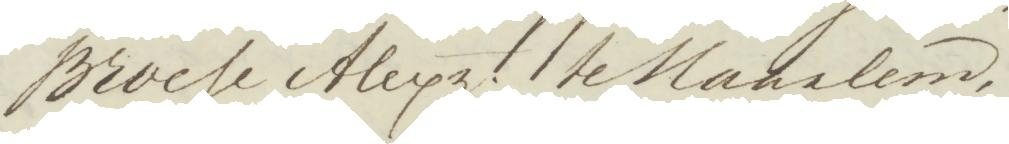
Broese Alexzn. te Haarlem,
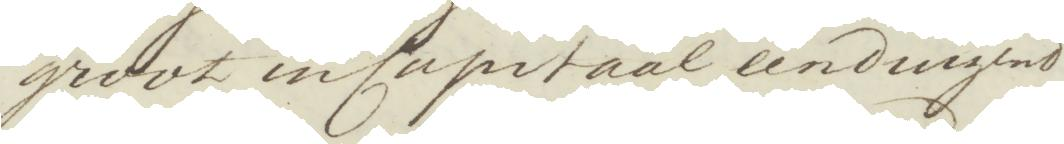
groot in Capitaal eenduizend
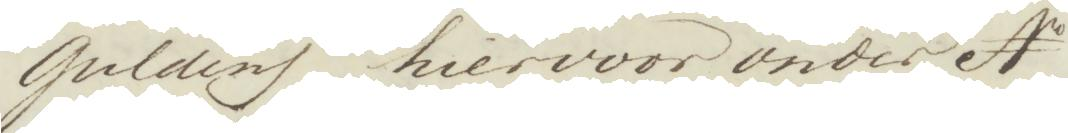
Guldens, hiervoor onder N=o
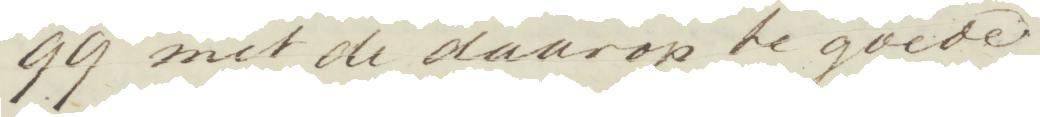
99 met de daarop te goede
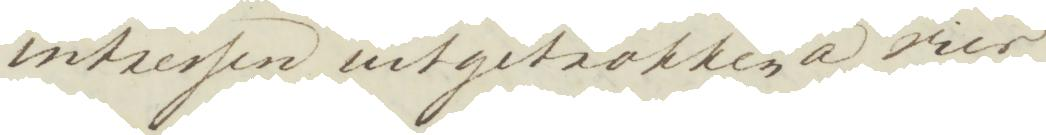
intressen uitgetrokken a vier
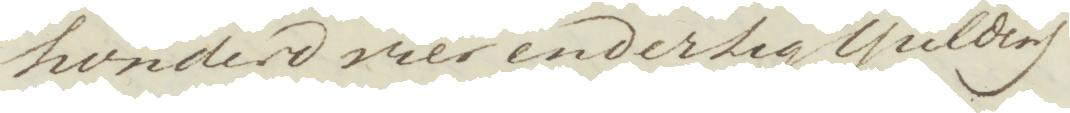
honderd vier endertig Guldens
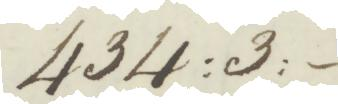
434:3: —
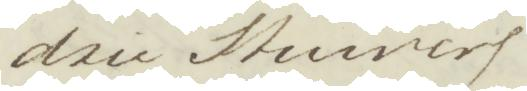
drie stuivers
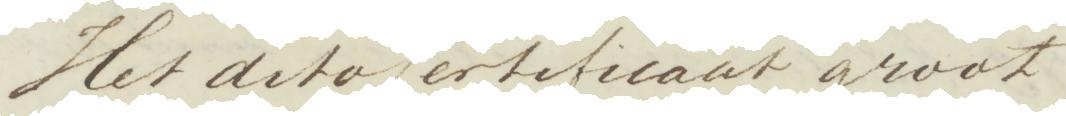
Het dito Certificaat groot
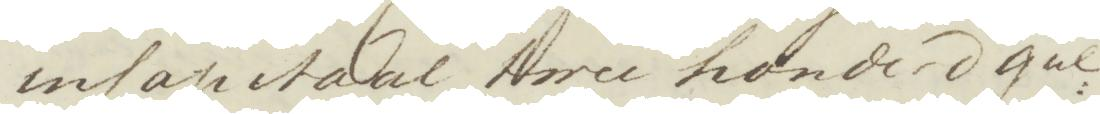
in Capitaal twee honderd gul„
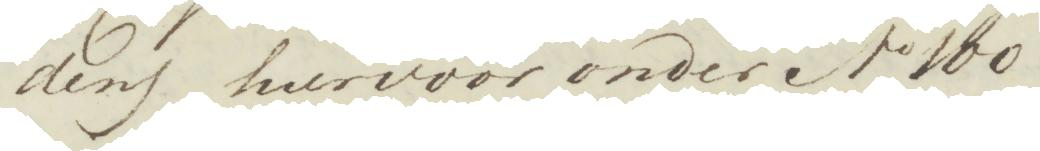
dens, hiervoor onder No 160
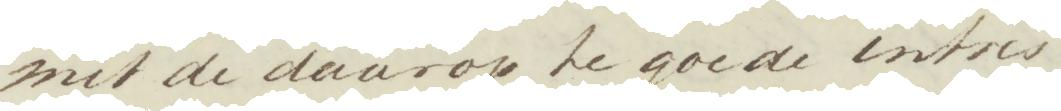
met de daarop te goede intres
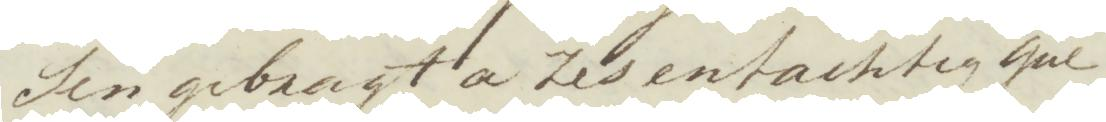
sen gebragt a zes entachtig gul:
